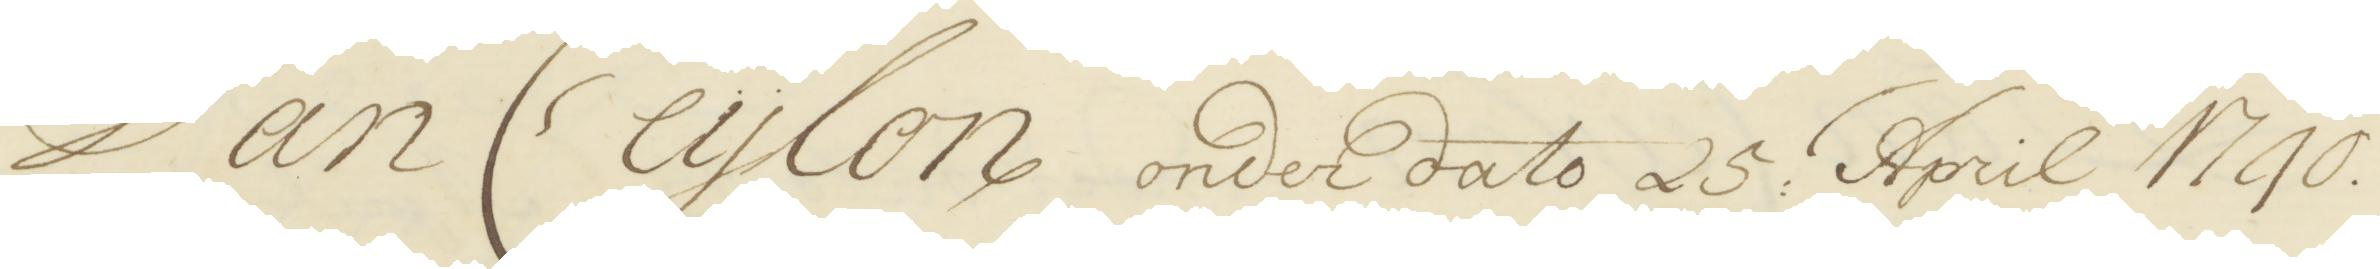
Van Ceijlon onder dato 25:' April 1740.
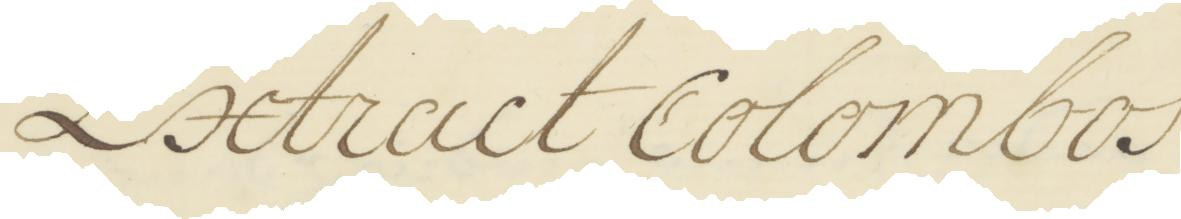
Extract Colombos
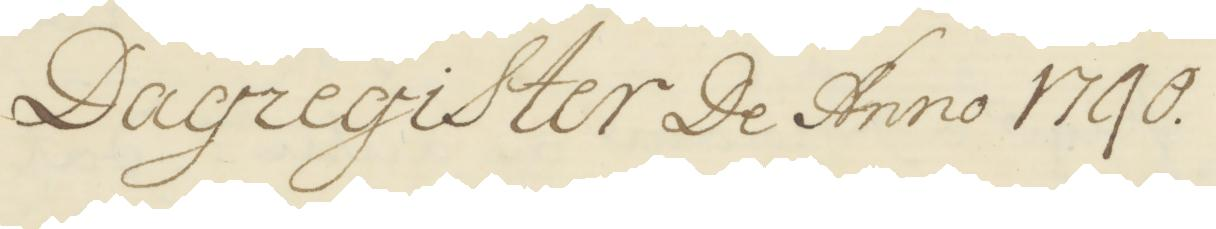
Dagregister De Anno 1740.
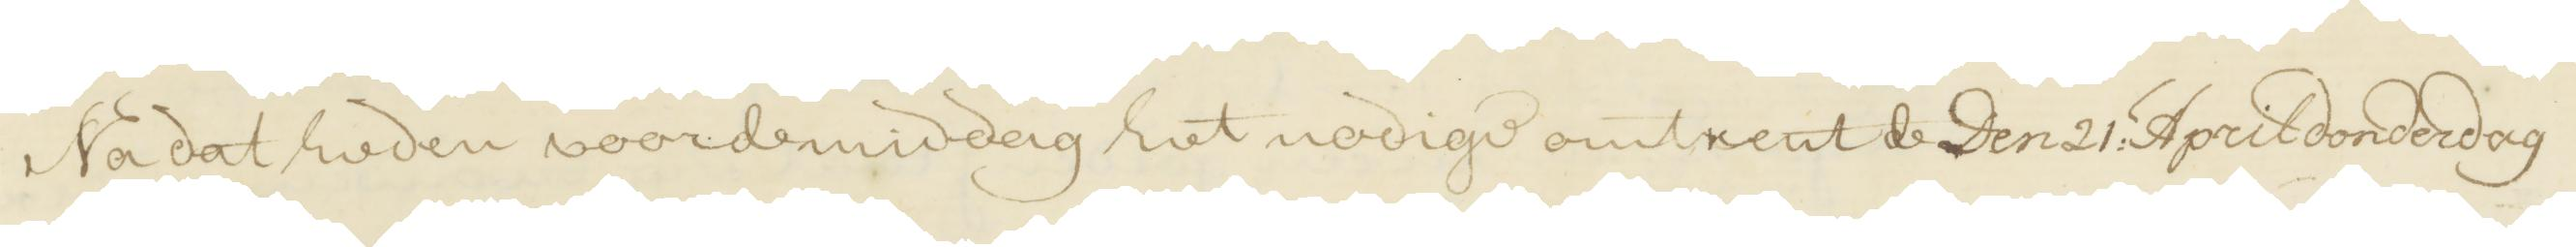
Nadat heden voor de middag het nodige omtrent de Den 21:' April donderdag
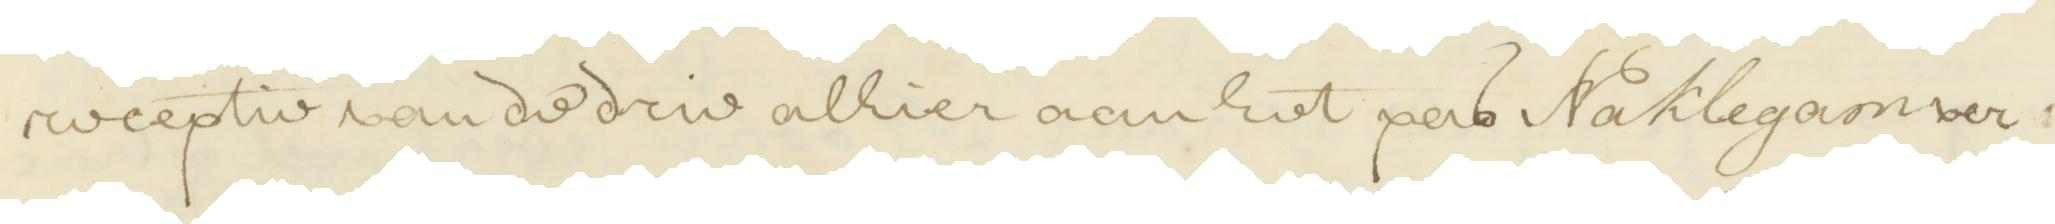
receptie van de drie alhier aan het pas Naklegam ver„
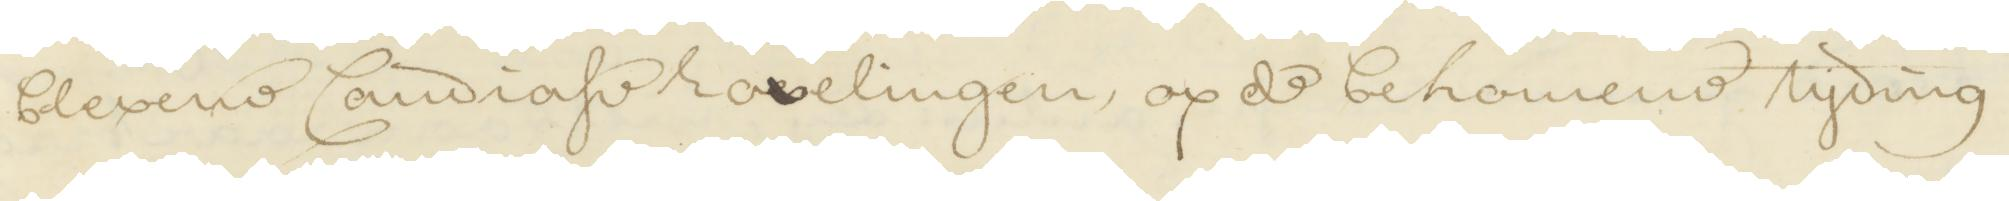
blevene Candiase hovelingen, op de bekomene tijding
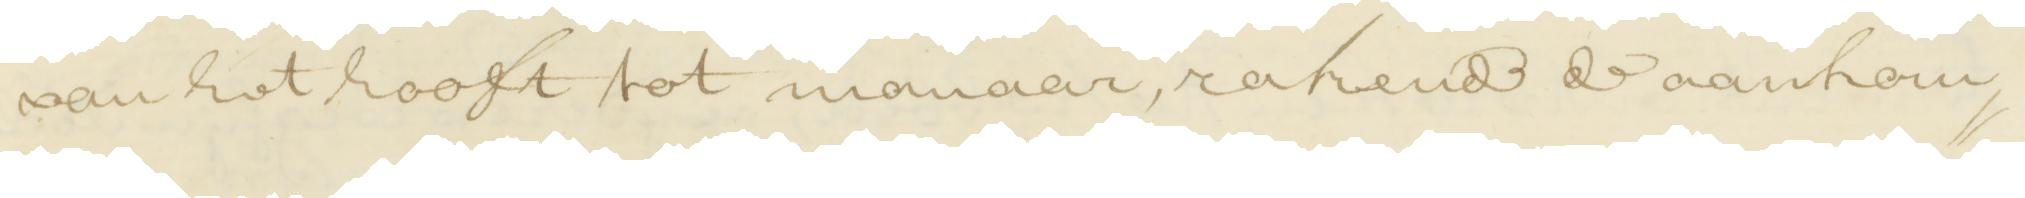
van het hooft tot manaar, rakende de aankom„
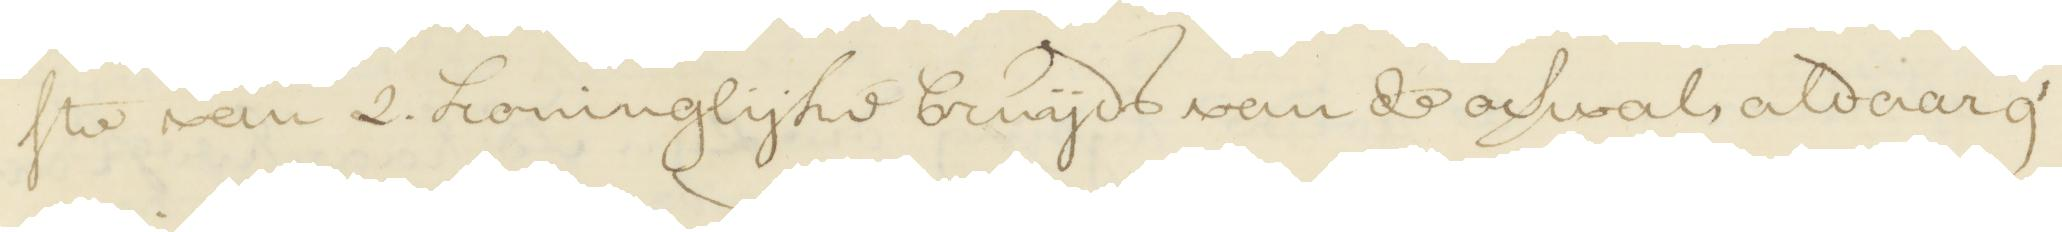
ste van 2. koninglijke bruijds van de overwal aldaar g’
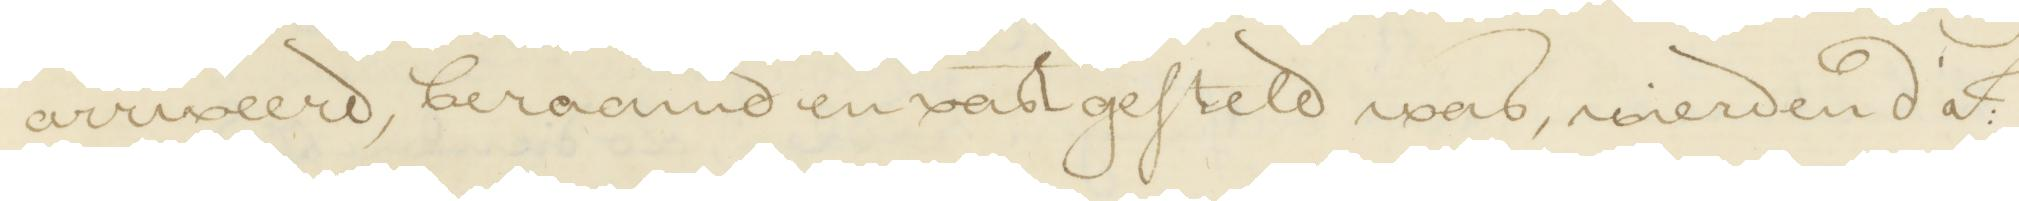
arriveerd, beraamd en vastgesteld was, wierden d’ E:
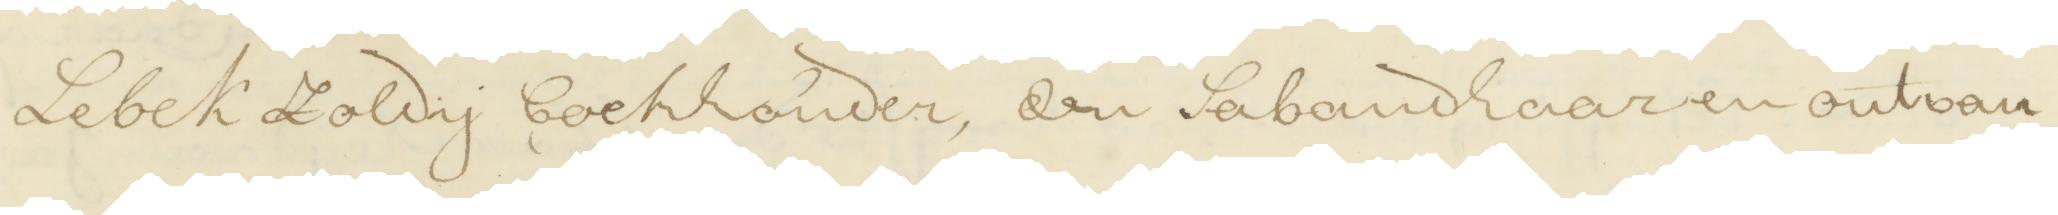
Lebek zoldij boekhouder, den sabandhaar en ontvan
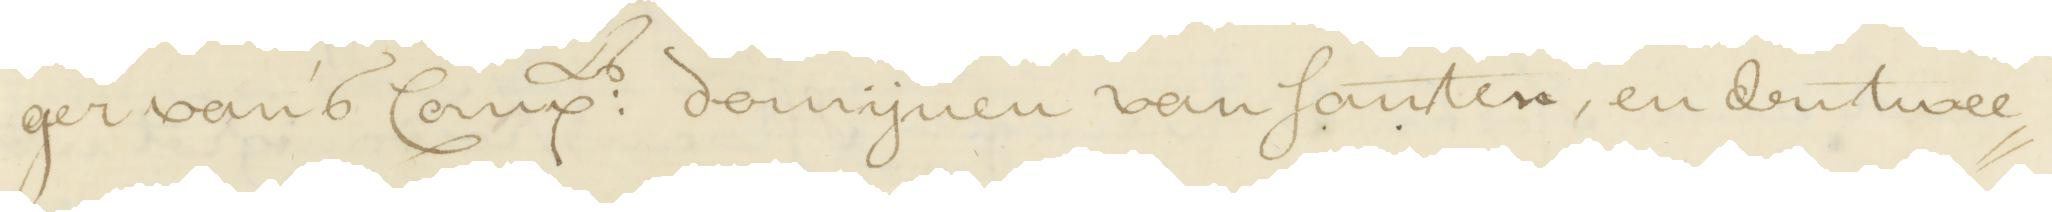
ger van ’s Comp:s domijnen van santen, en den twee„
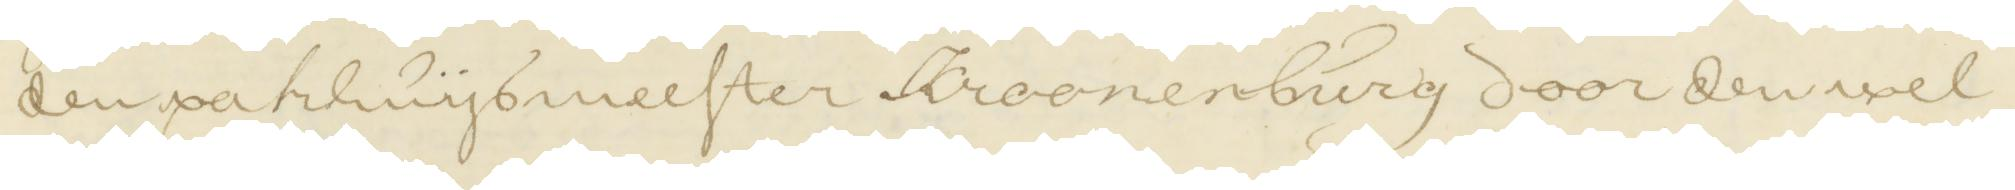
den pakhuijsmeester kroonenburg door den wel
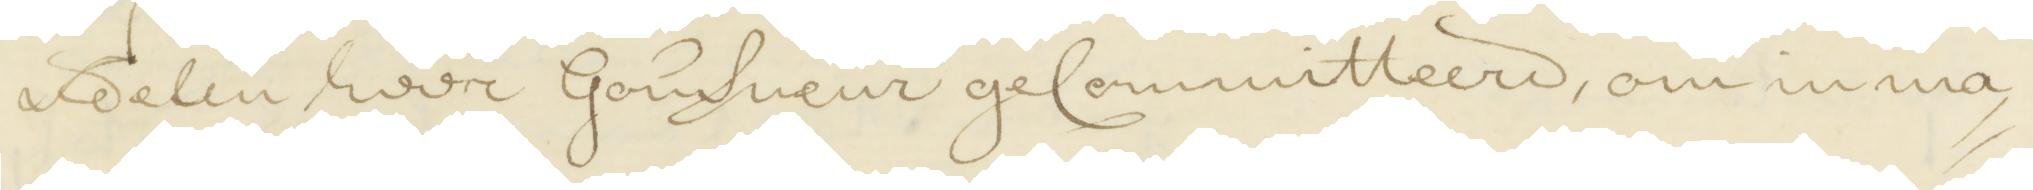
Edelen heer Gouverneur gecommitteerd, om in ma„
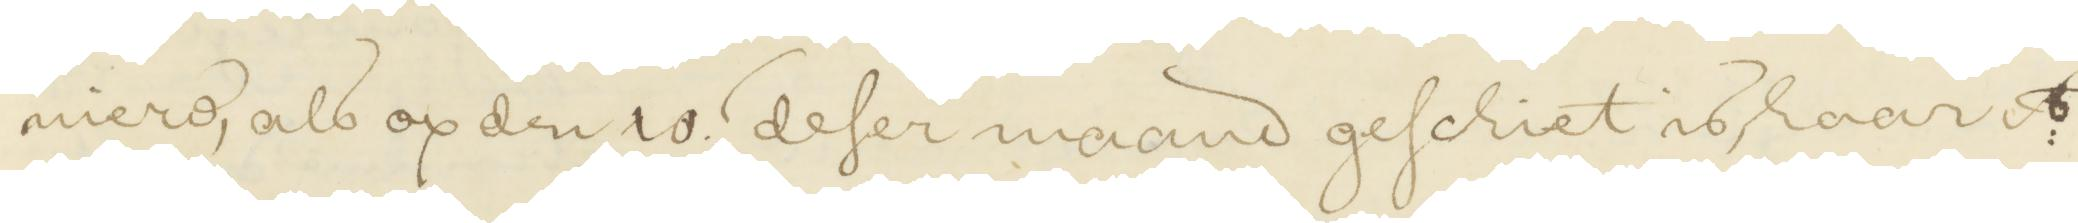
niers, als op den 10.' deser maand geschiet is, haar Ed:
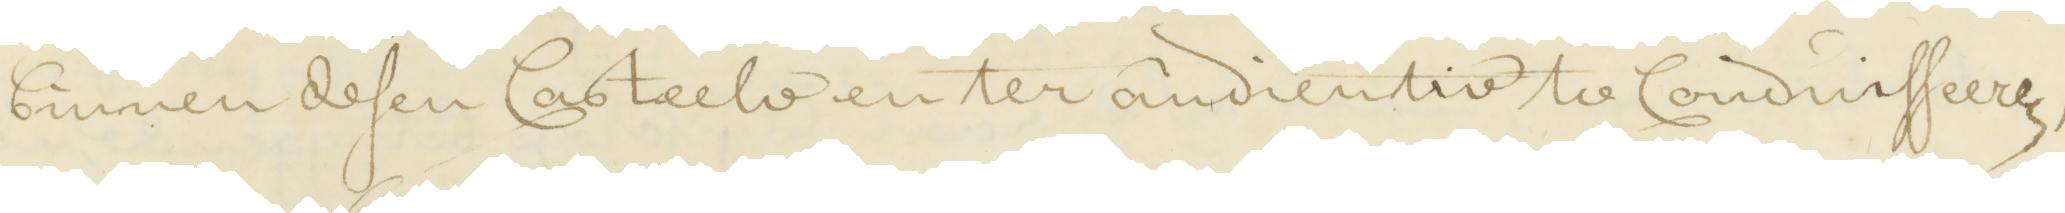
binnen desen Casteele en ter audientie te Conduisseeren,
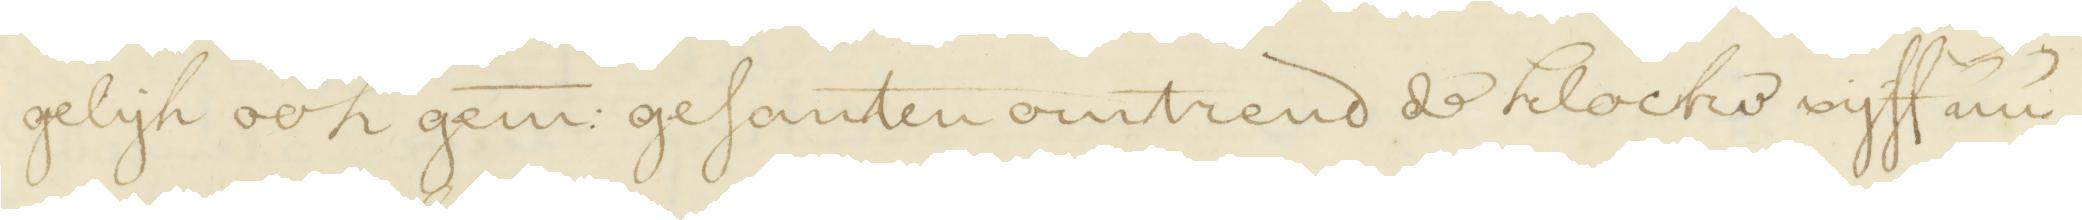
gelijk ook gem: gesanten omtrend de klocke vijff uu
